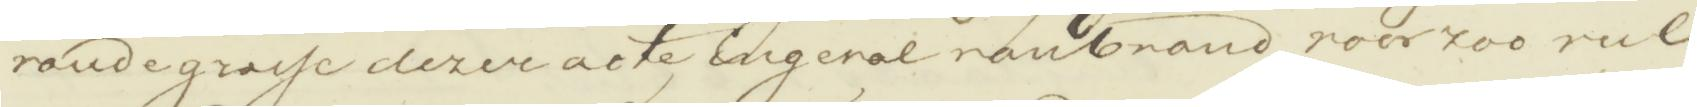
vande grosse dezer acte, ingeval vanbrand, voor zoo vel
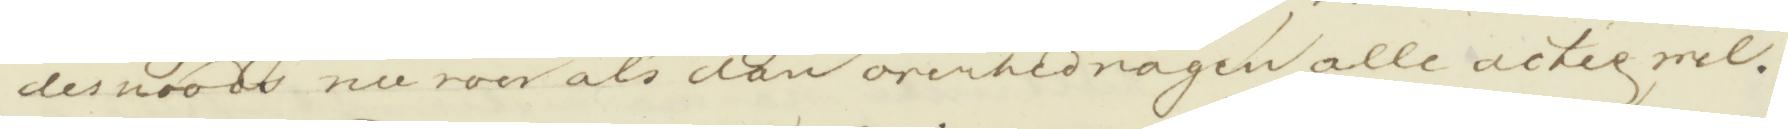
desnoods nu voor als dan overtedragen, alle acten wel„
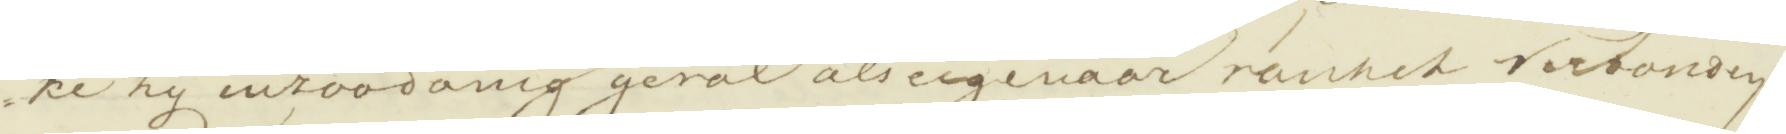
„ke hij inzoodanig geval als eigenaar vanhet verbonden
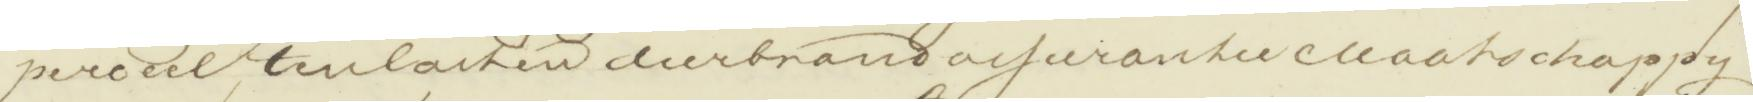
perceel, ten lasten dierbrand assurantie Maatschappy
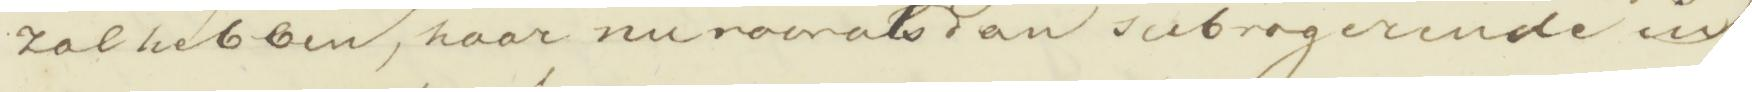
zal hebben, haar nu voorals dan subrogerende in
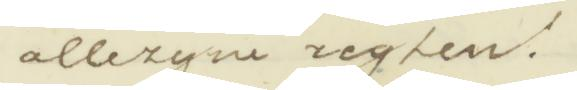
allezyne regten.
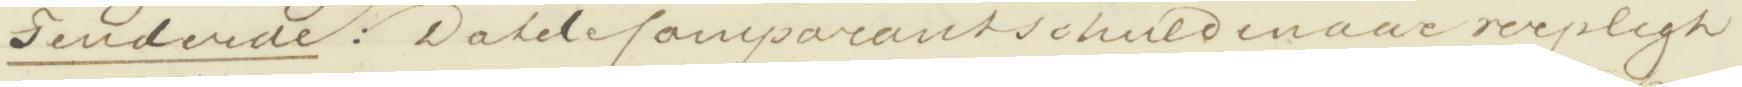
Tenderde : DatdeComparantschuldenaar verpligt
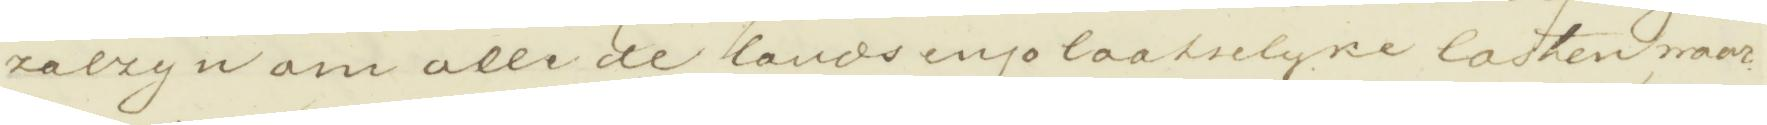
zalzyn om alle de lands enplaatselyke lasten waar
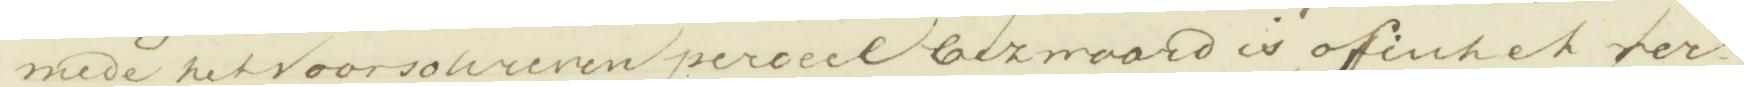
mede hetvoorschreven perceel bezwaard is ofinhet ver„
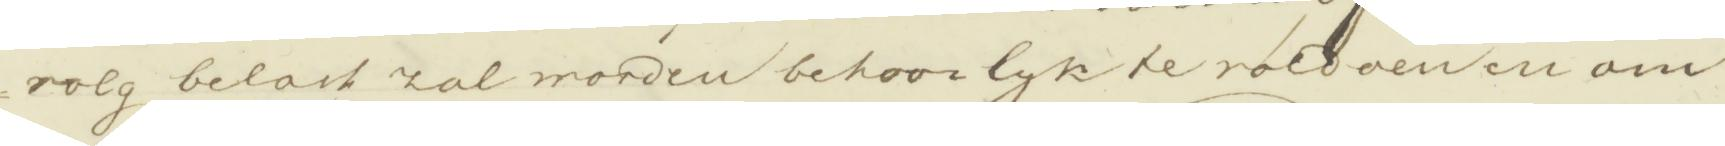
volg belast zal worden behoorlyk te voldoen en om
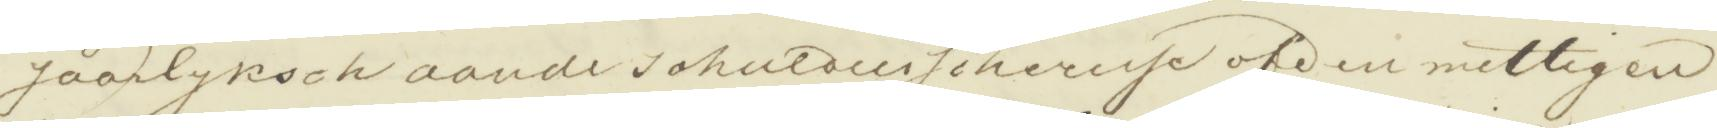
Jaarlyksch aande schuldeisscheresse ofden wettigen
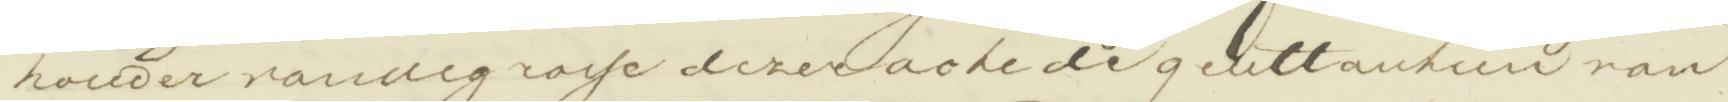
houder vandegrosse dezer acte de quittantien van
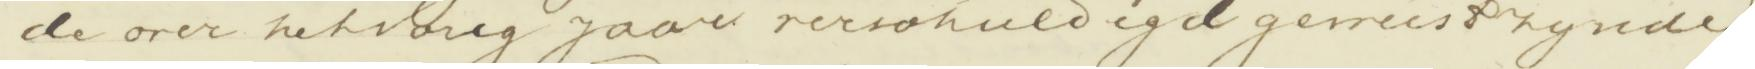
de over hetvorig jaar verschuldigd geweest zynde
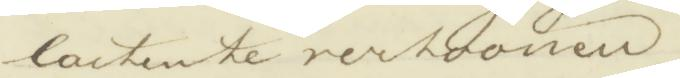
lasten te vertoonen
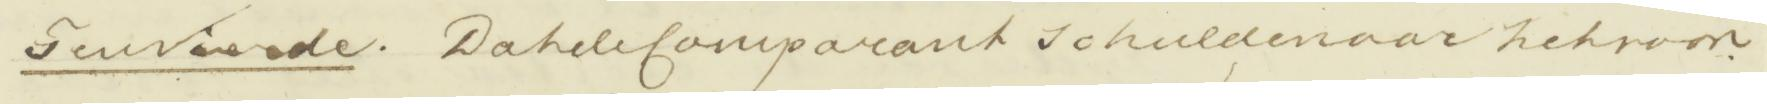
Tenvierde. DatdeComparant schuldenaar hetvoor
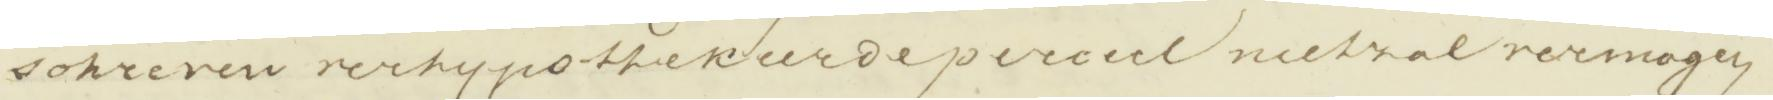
schreven verhypothekeerdeperceel nietzal vermogen
